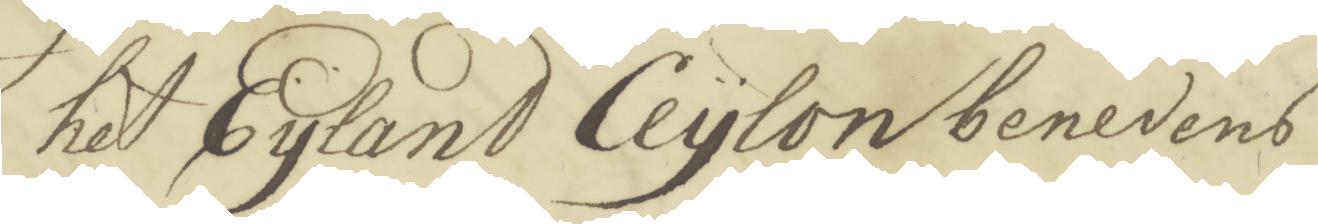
het Eijland Ceijlon benevens
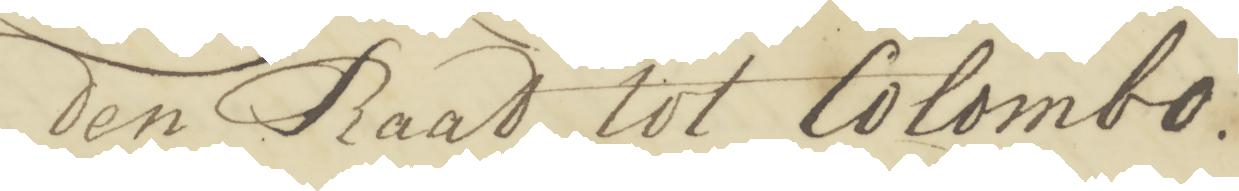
den Raad tot Colombo.
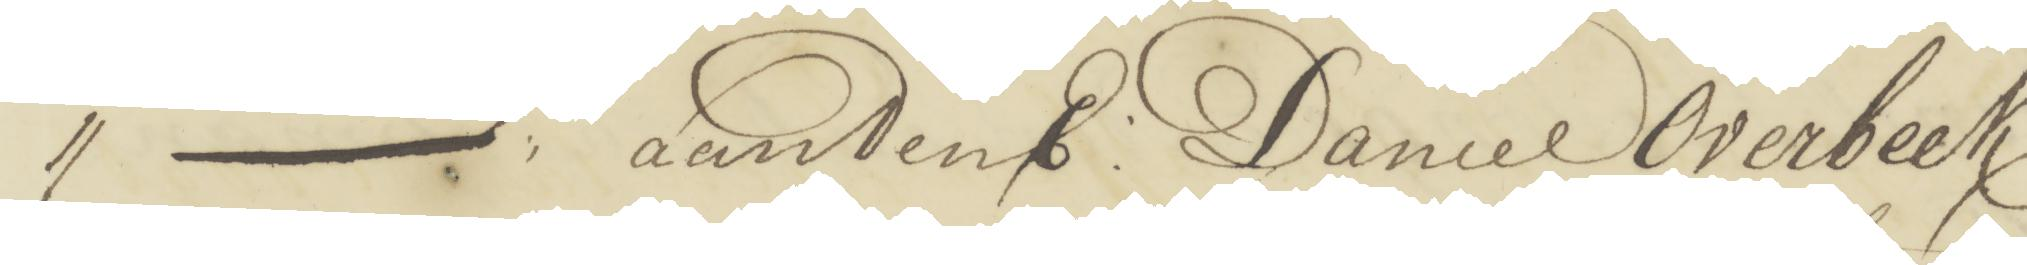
„ —:o aan den E: Daniel Overbeek
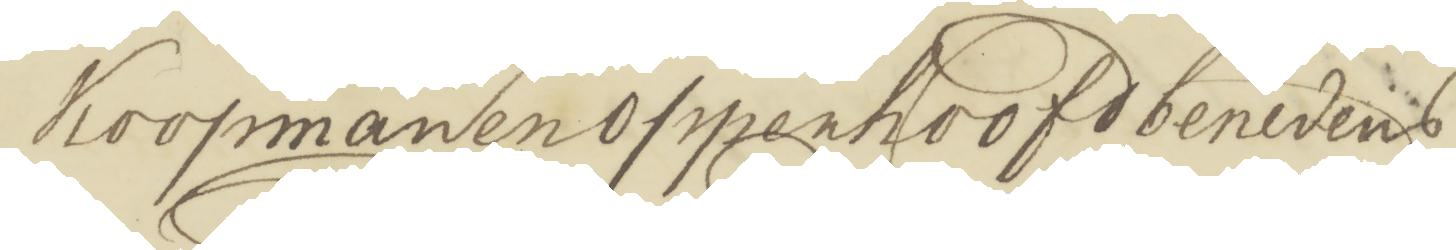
Koopman en opperhoofd benevens
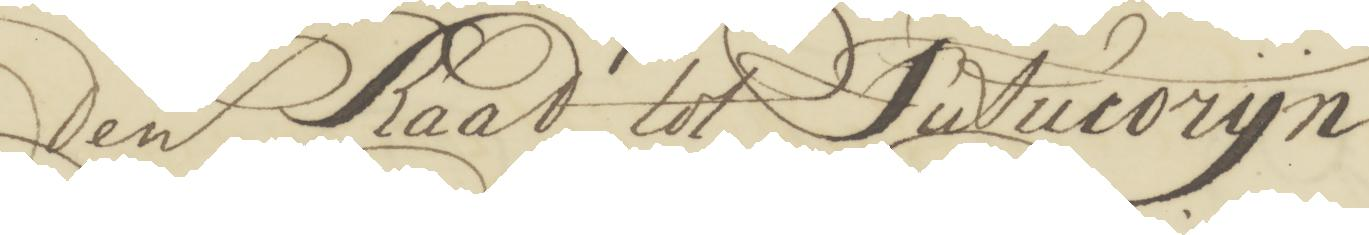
den Raad tot Tutucorijn
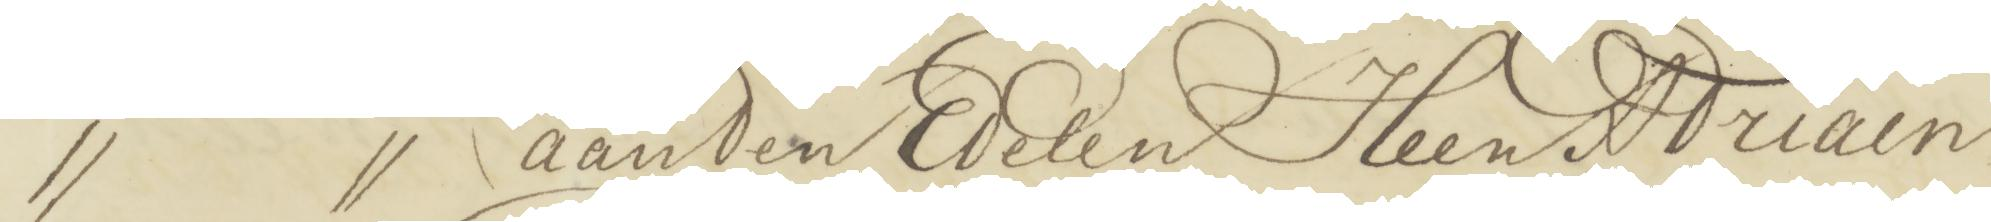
„ „ aan den Edelen Heer Adriaen
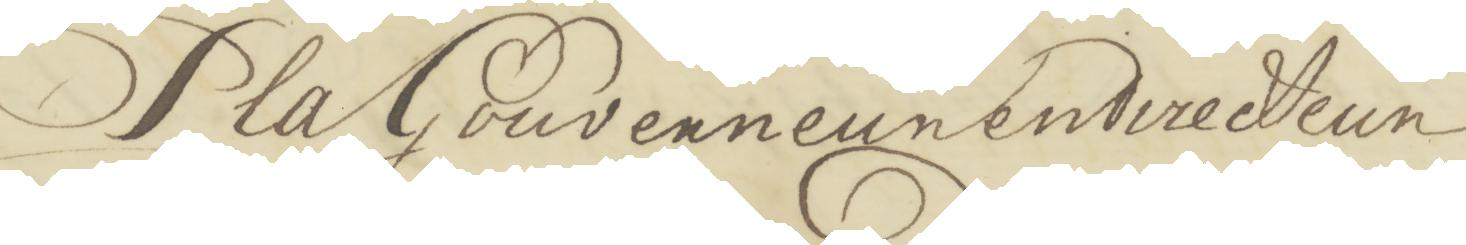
Pla Gouverneur en directeur
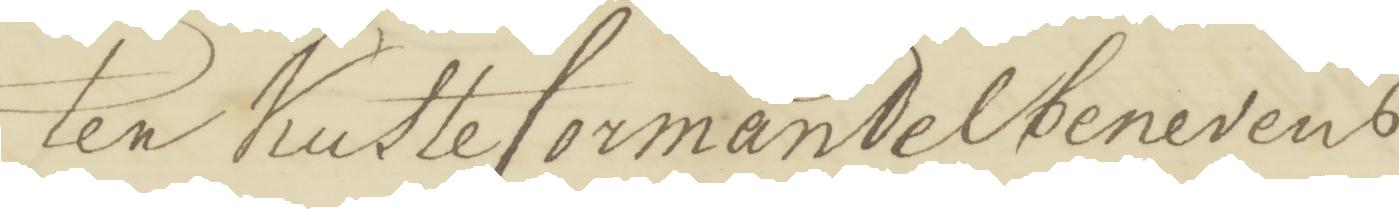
ter Kuste Cormandel benevens
